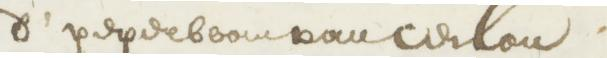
d’ peperboom van ceilon
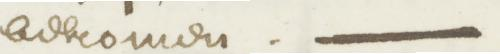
bekomen. —
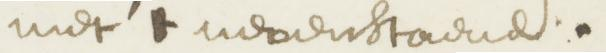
met ’t nevenstaende.
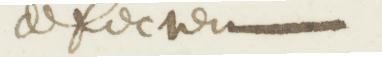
defecten
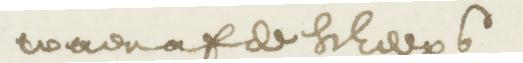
waeraf de scheeps
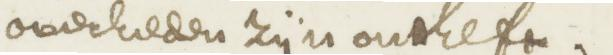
overheden zijn ontheft.
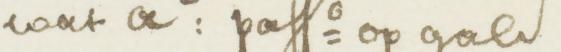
wat a:o pass=o op gale
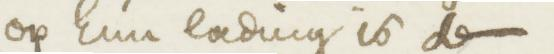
op hun lading is te
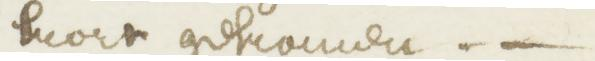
kort gekomen. —
